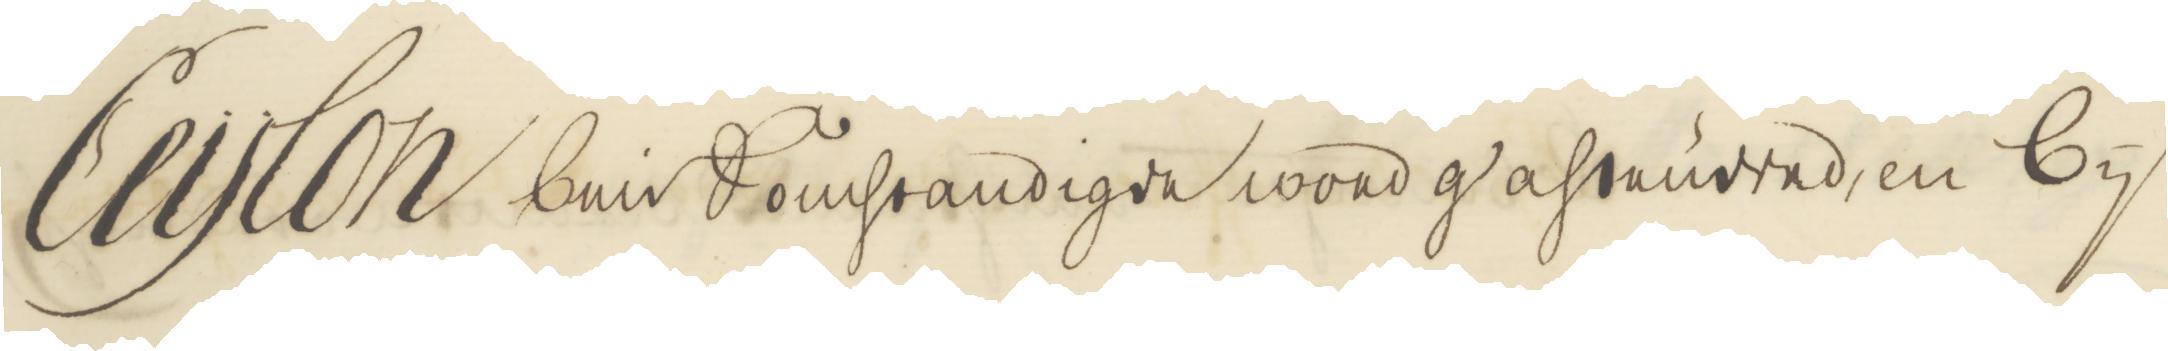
Ceijlon brief omstandiger word g'astrueerd, en bij
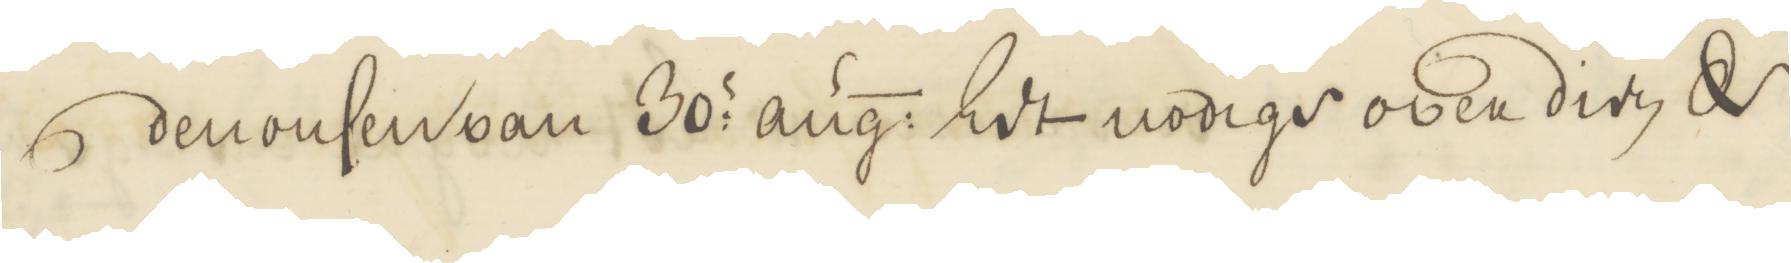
den onsen van 30: Aug: het nodige over dien de
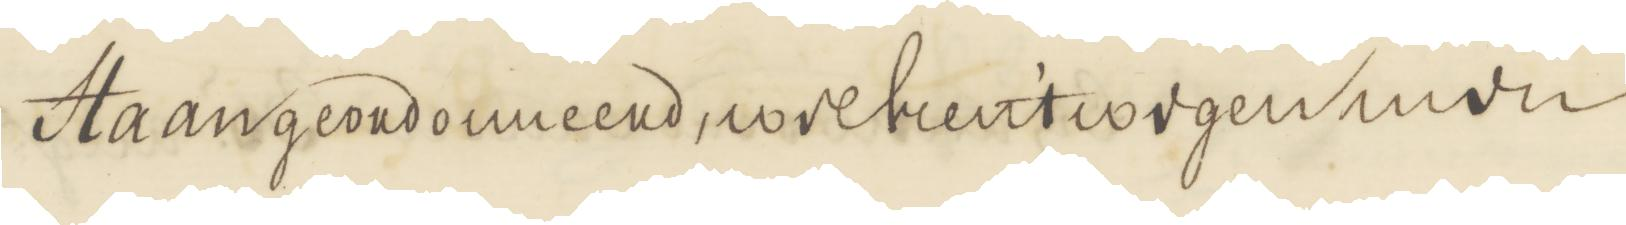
staan geordonneerd, welken 't wegen men
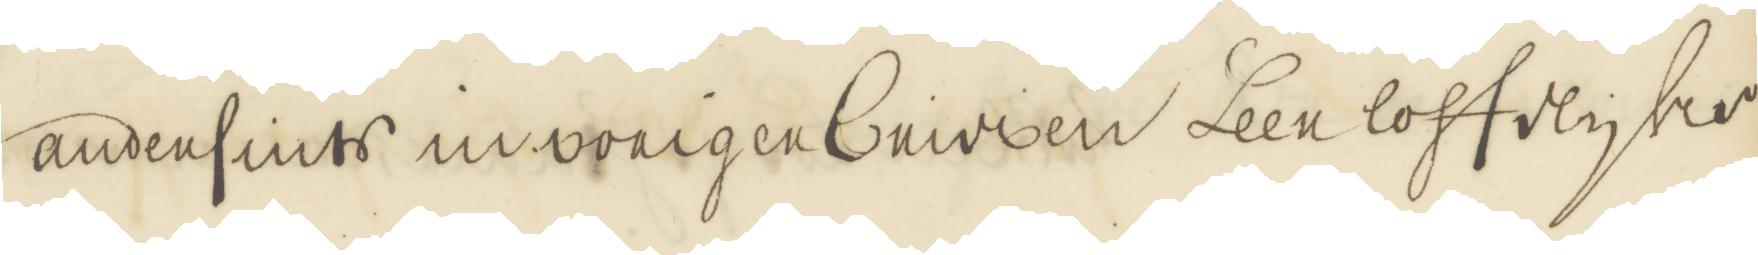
andersints in voriger brieven seer loffelijke
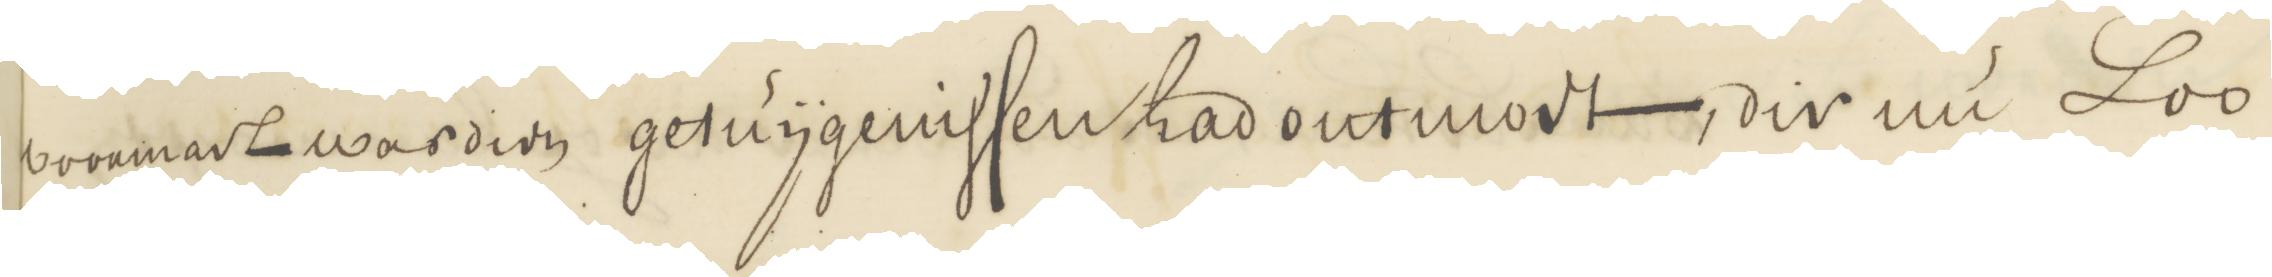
voormael was dien getuijgenissen had ontmoet, die nu soo
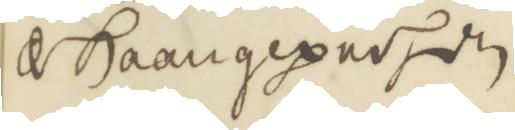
de Haangepresen
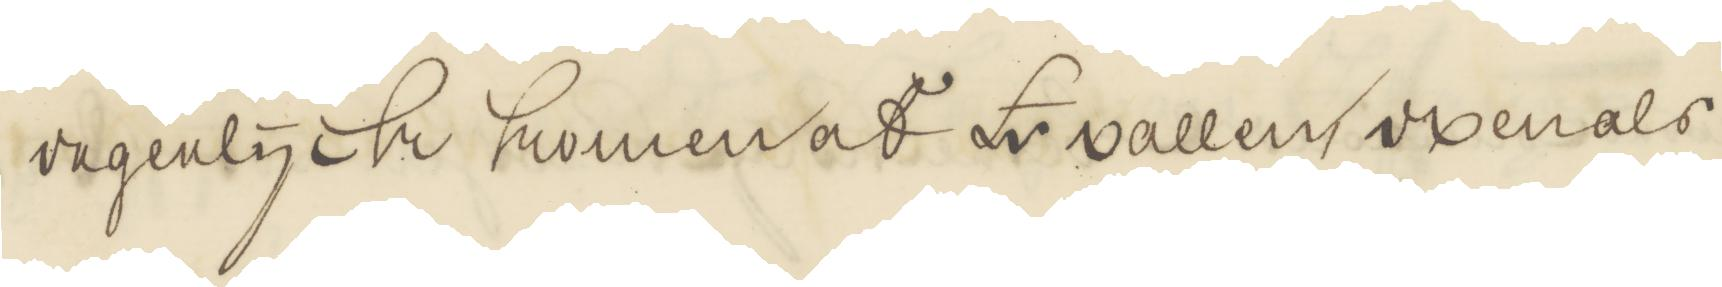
regerlijck komen af te vallen evenals
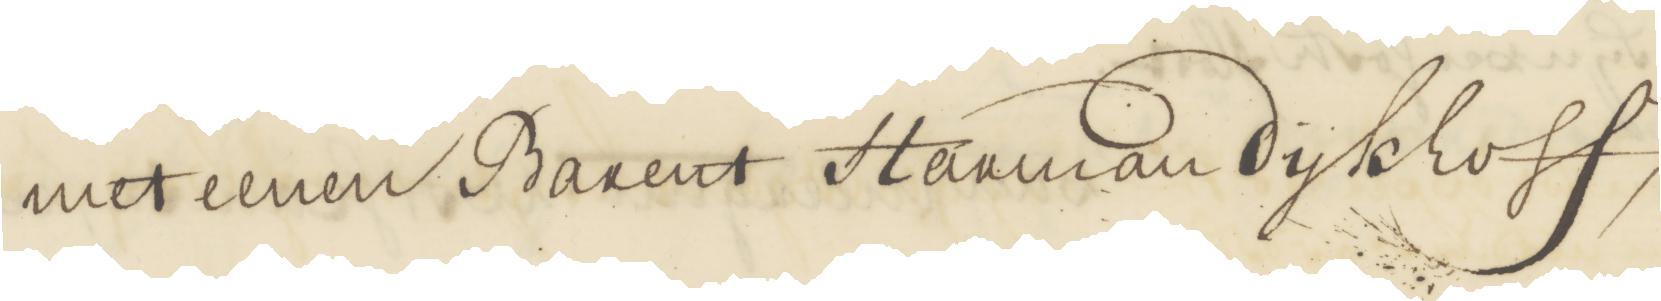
met eenen Barent Harman Dijkhoff,
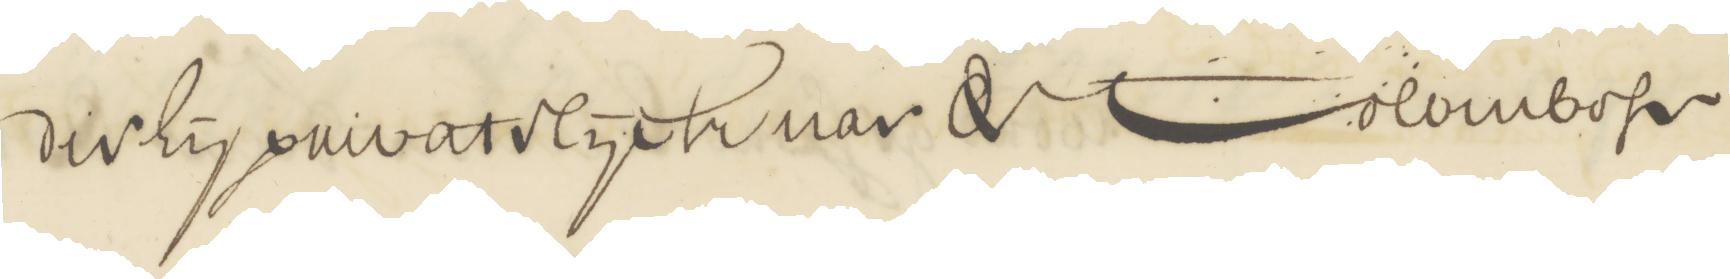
die hij privatelijck nae de Colombose
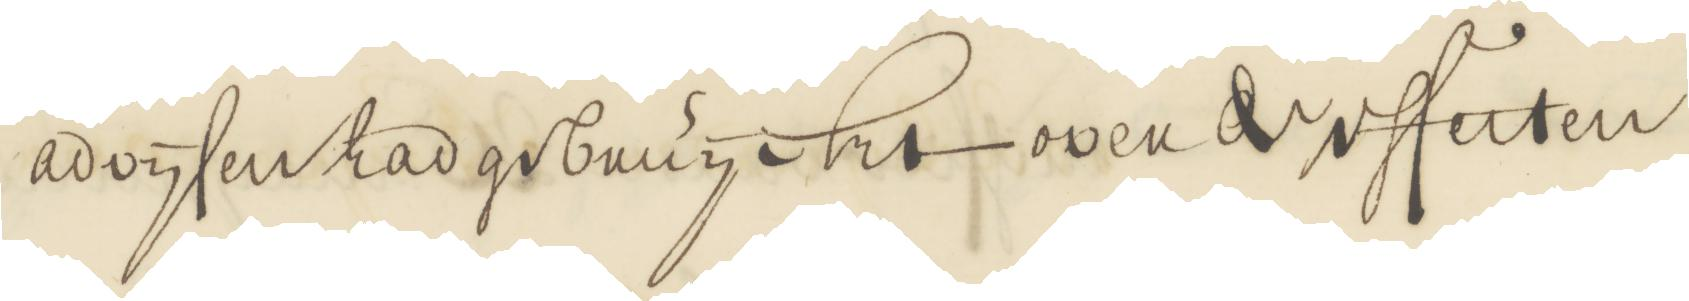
advijsen had gebruijckt over de effecten
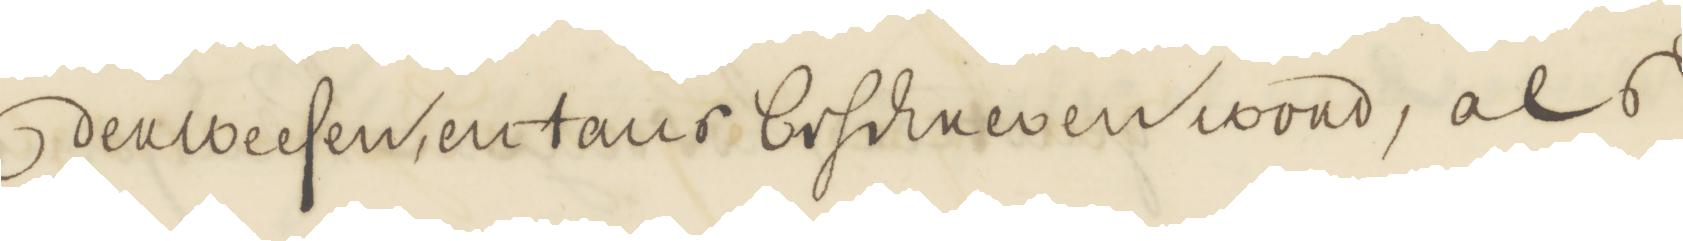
derweesen, en tans beschreven word, als
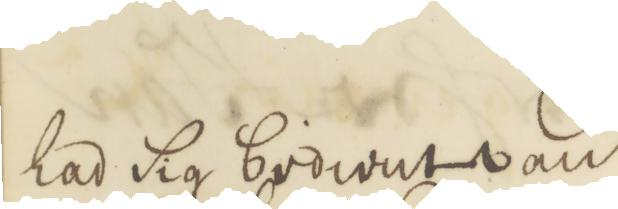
had sig bedient van
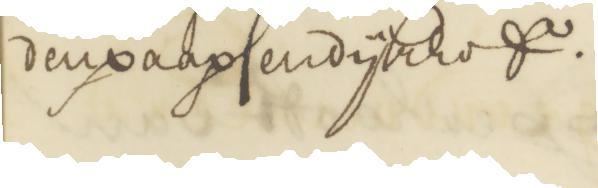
den paapsendijkhof.e
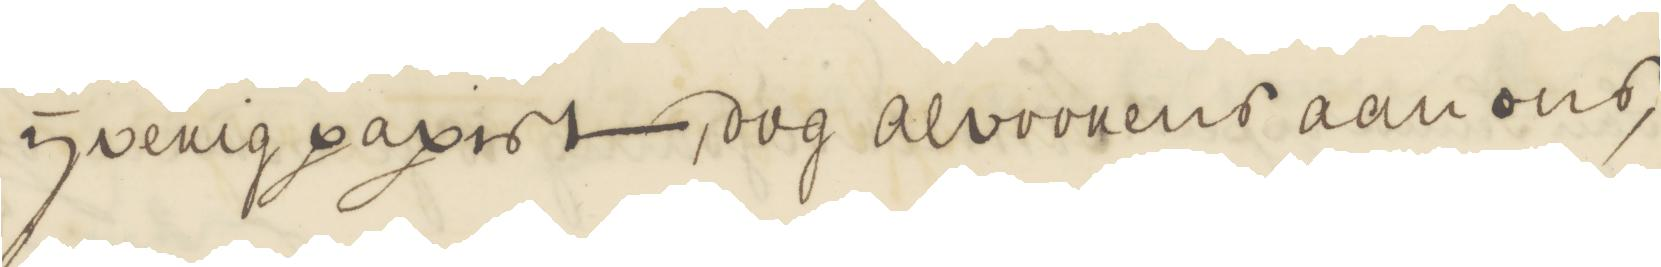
ijverig papist, dog alvoorens aan ons,
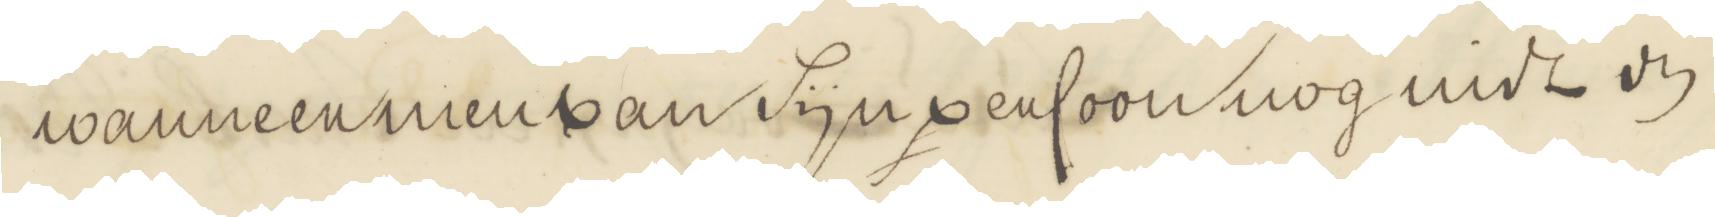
wanneer men van sijn persoon nog niet en
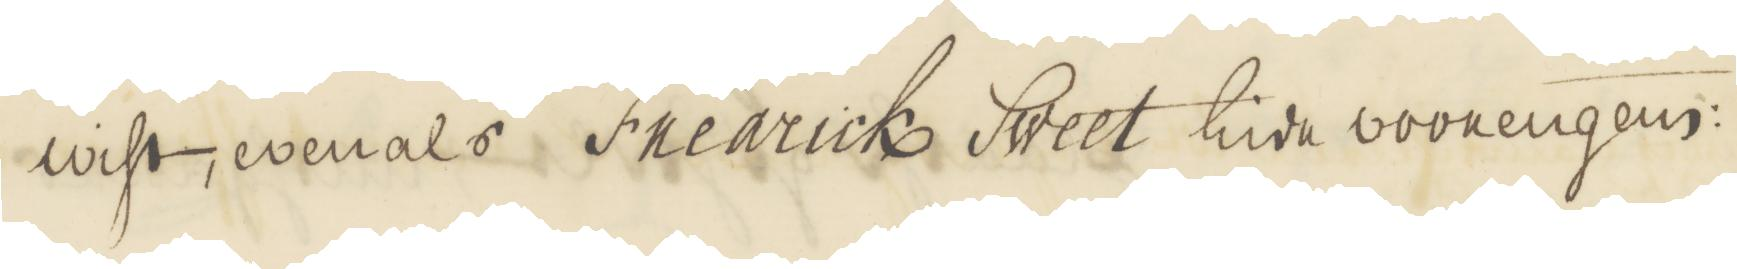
wist, even als Fredrick Sweet hier voorengem:
